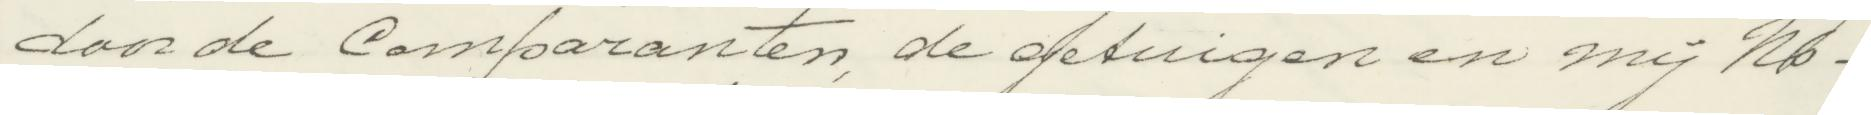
door de comparanten, de getuigen en mij No-
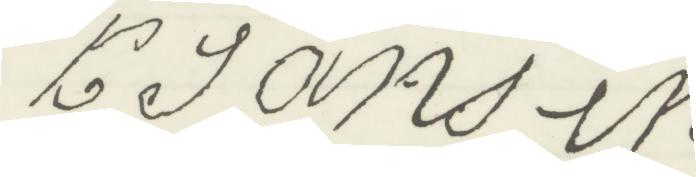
K Jansen
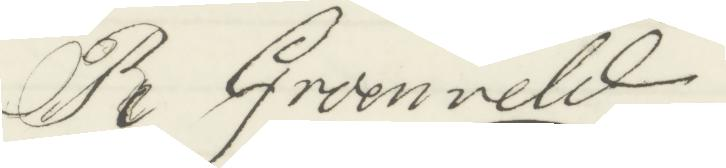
R Groenveld
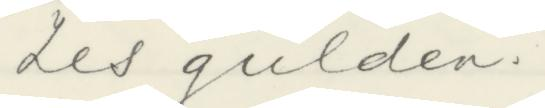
Zes gulden.
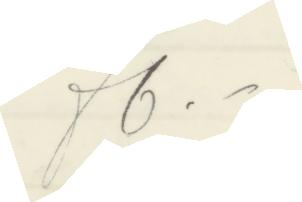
ƒ6. –
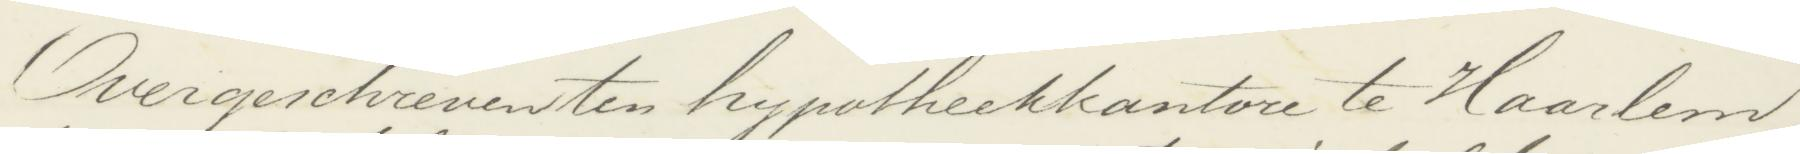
Overgeschreven ten hypotheekkantore te Haarlem
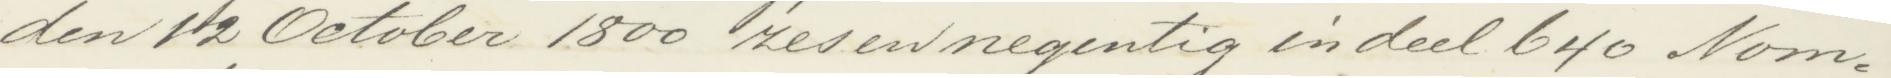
den 12 October 1800 zes en negentig in deel 640 Nom=
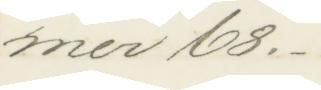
mer 68. -
